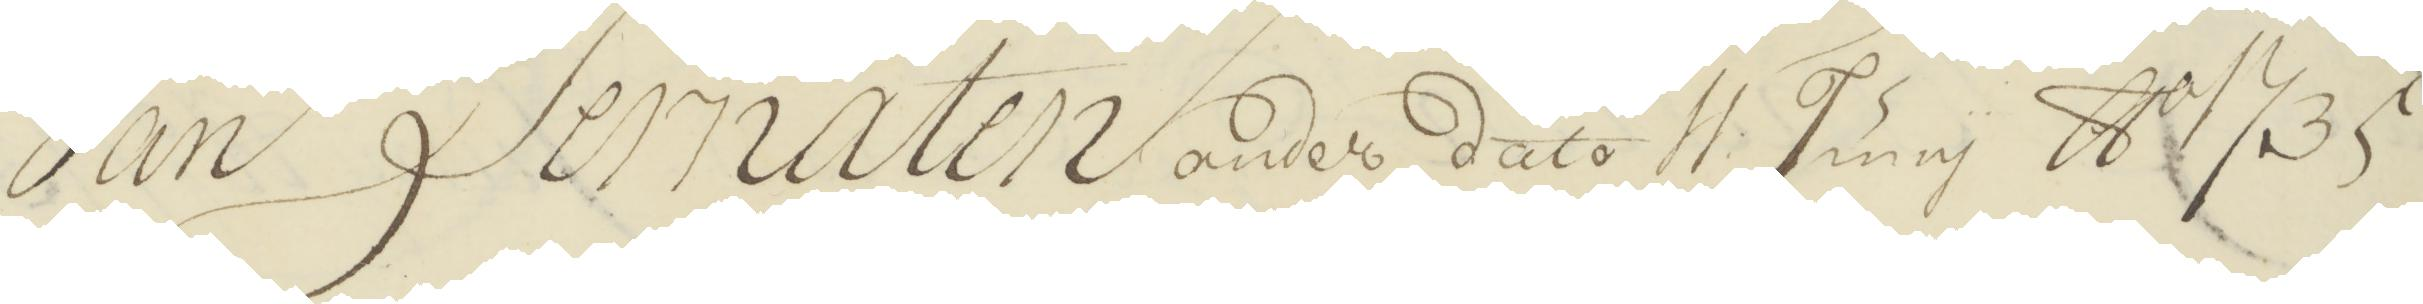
Van Ternaten onder dato 11:' Junij Ao 1735
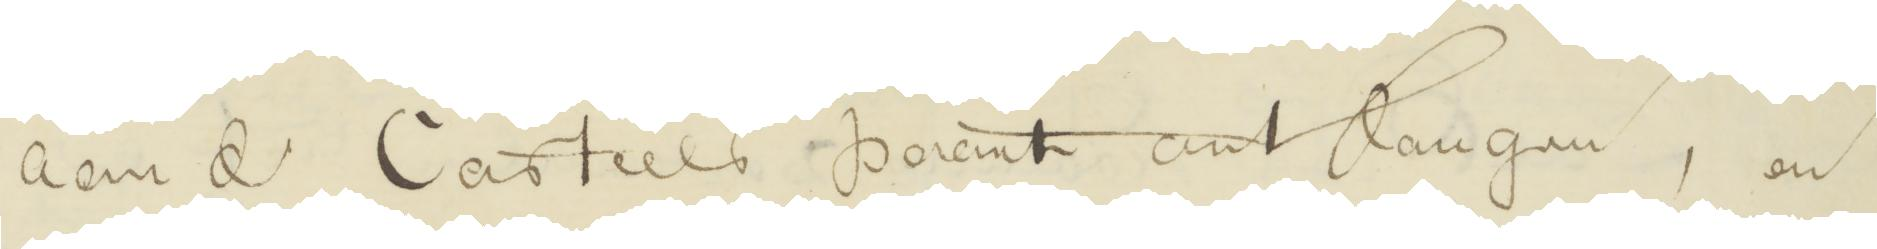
aan de Casteels poort ontfangen, en
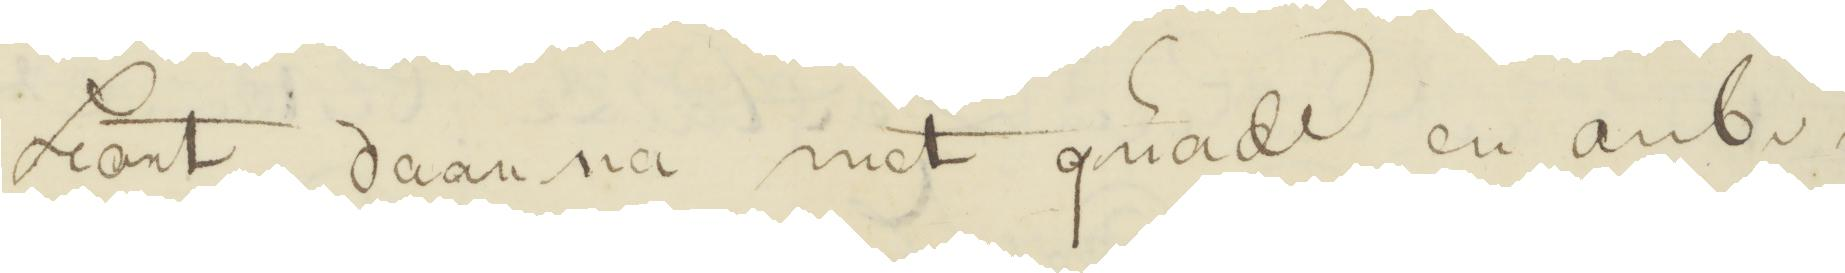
kort daarna met quade en onbe
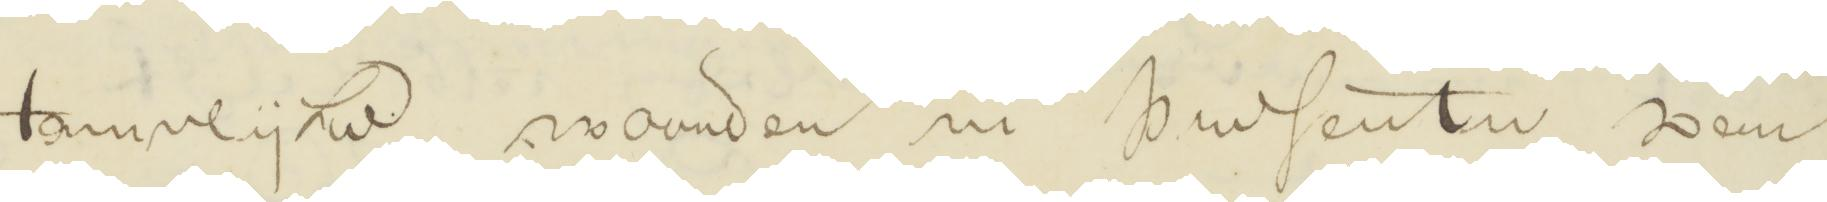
tamelijke woorden in presentie van
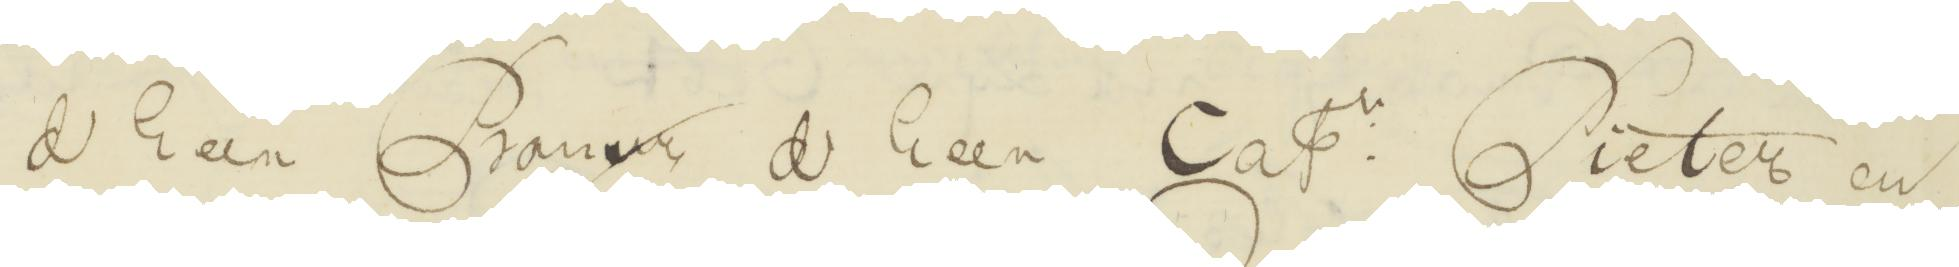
de heer Baner de heer Cap:n Pieter en
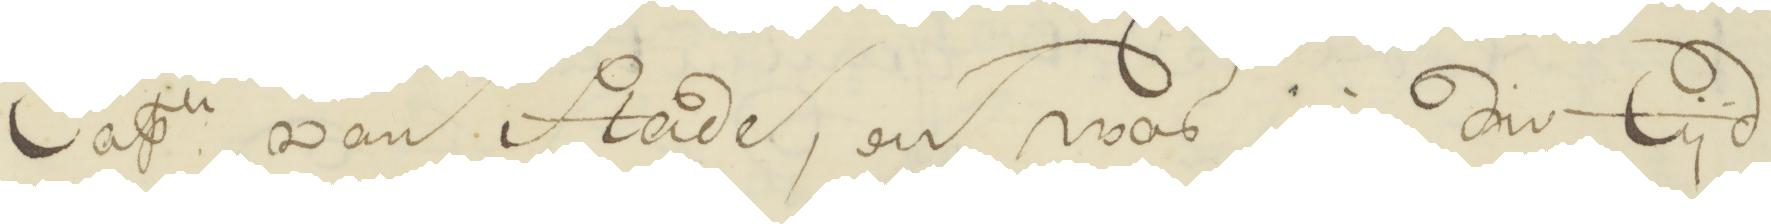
Cap:n van stade, en was die tijd
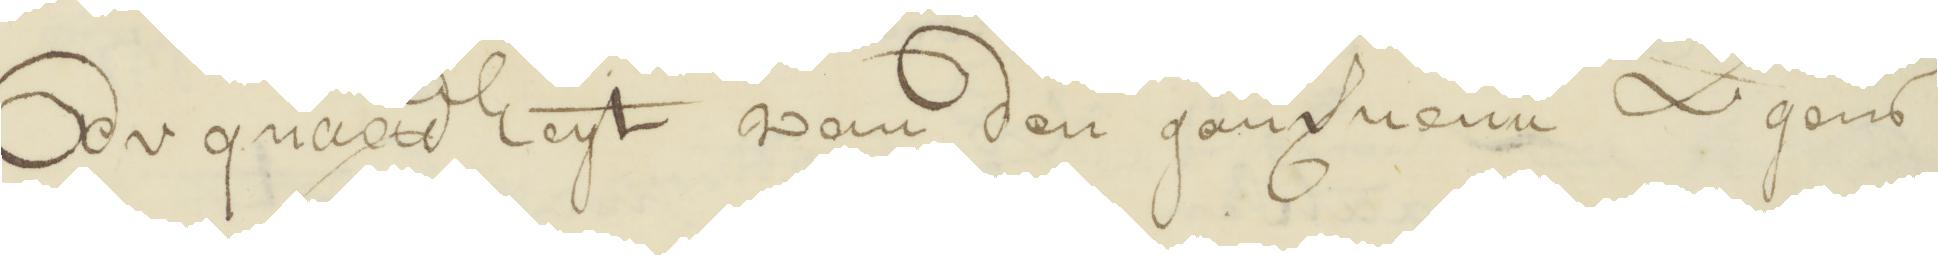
de quaadheijt van den gouverneur tegens
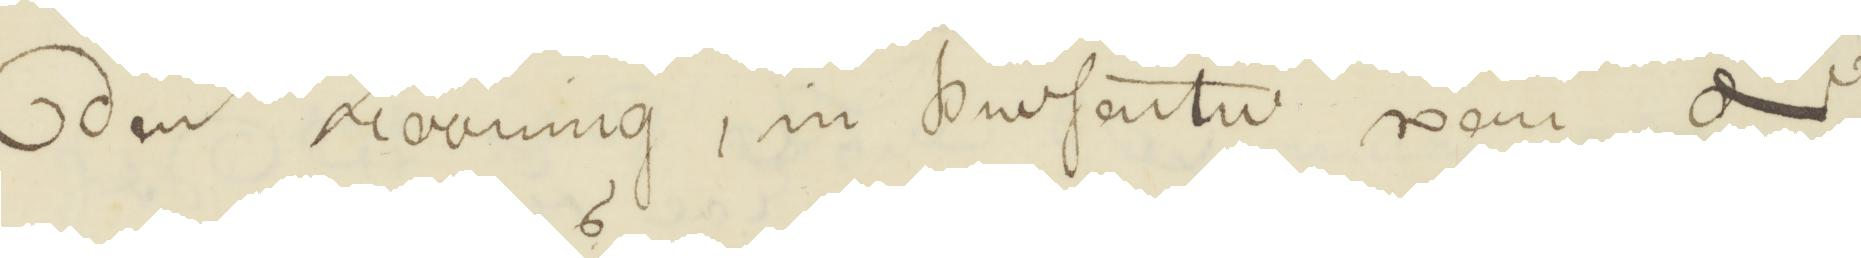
den kooning, in presentie van de
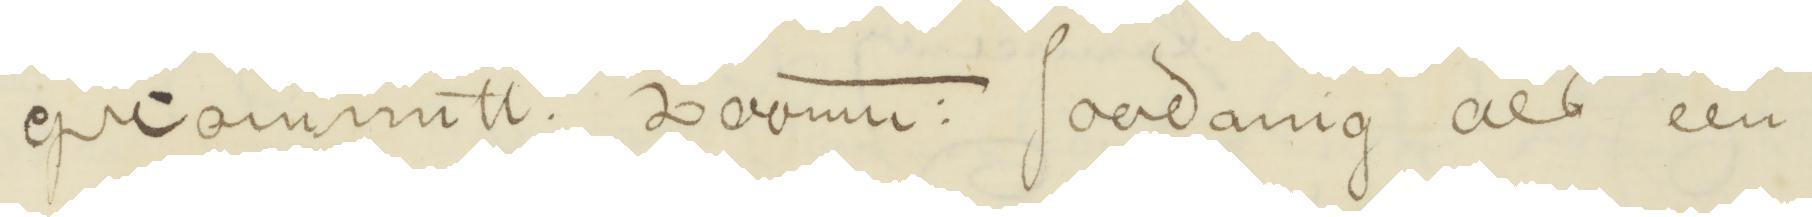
gecommitt:s voorm: soodanig als een
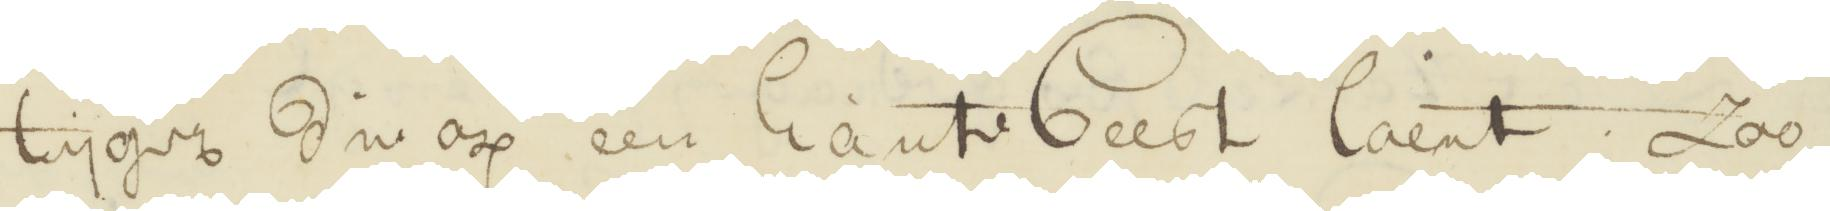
tijger die op een harte beest loert: zoo
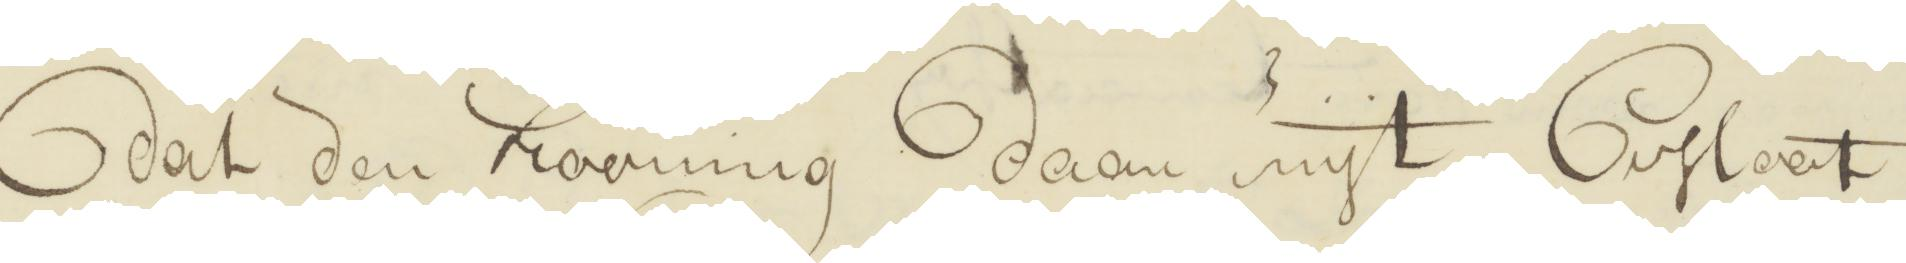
dat den kooning daar uijt besloot
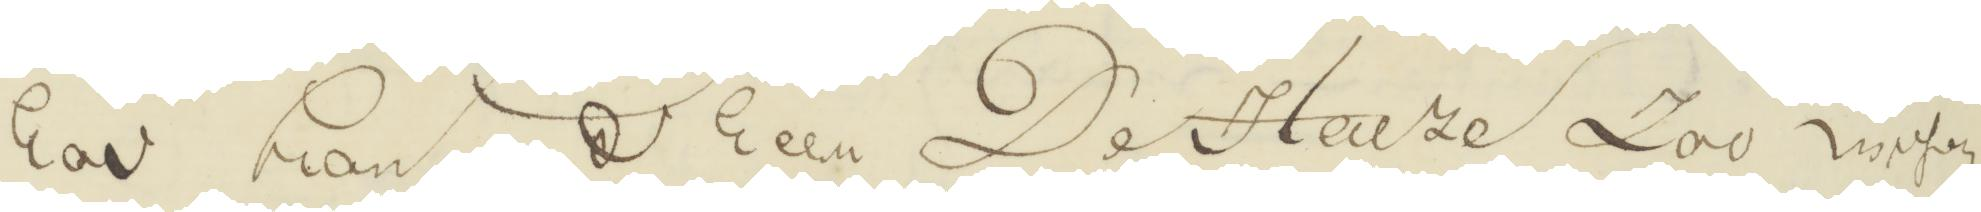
hoe kan de heer De Haeze zoo wese
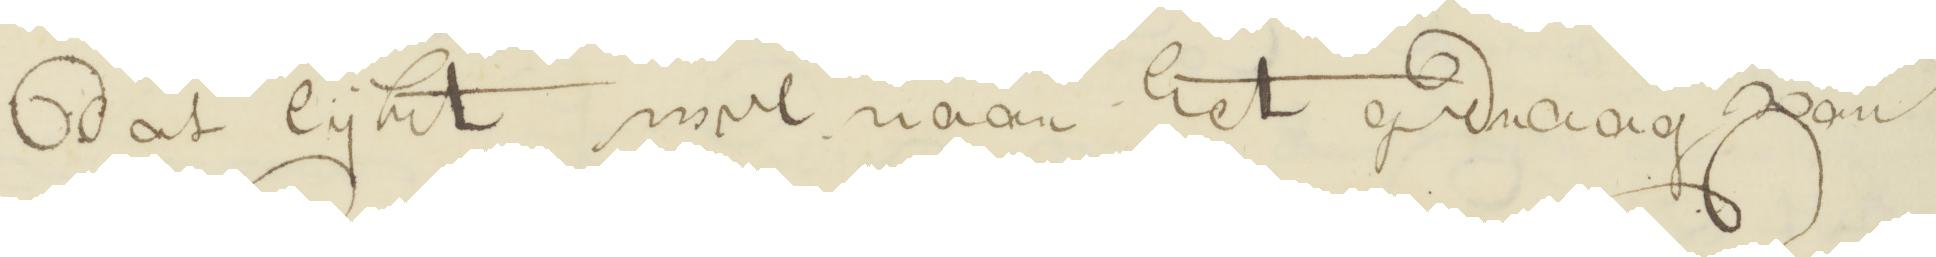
dat lijkt wel naar het gedraag van
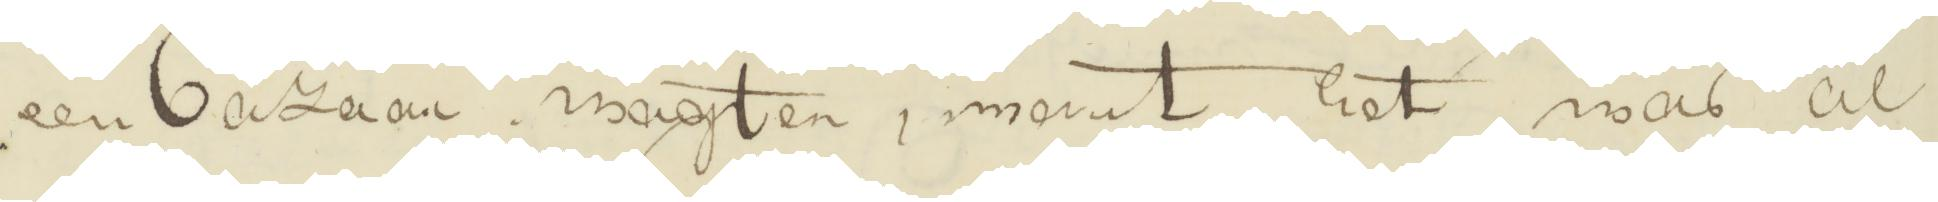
een bazaar wagter, want het was al
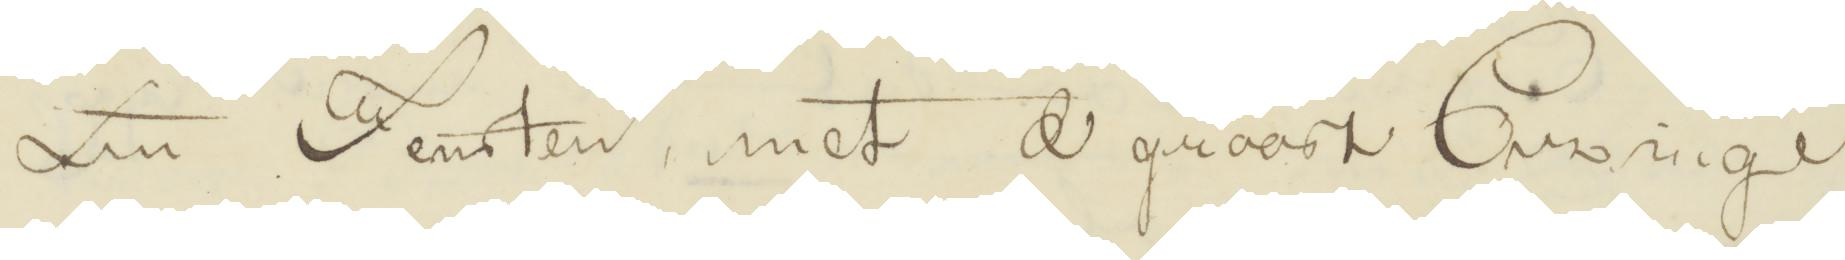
ten Eersten, met de grooste bevinge
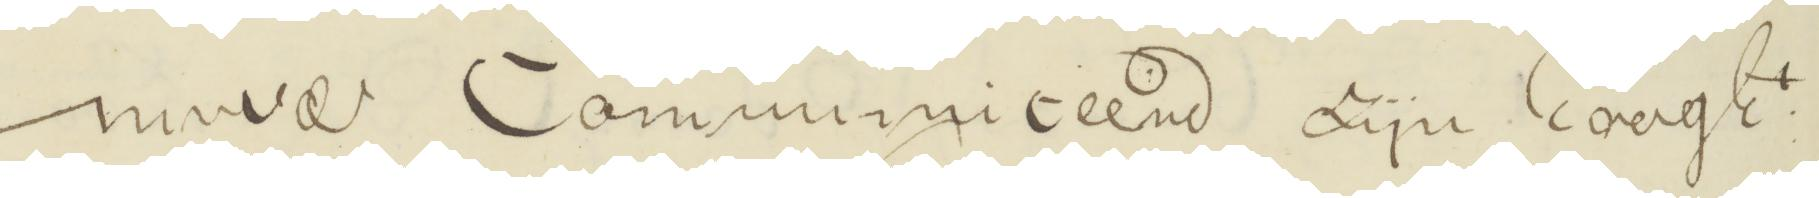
meede Communiceerd zijn hoogh:t
